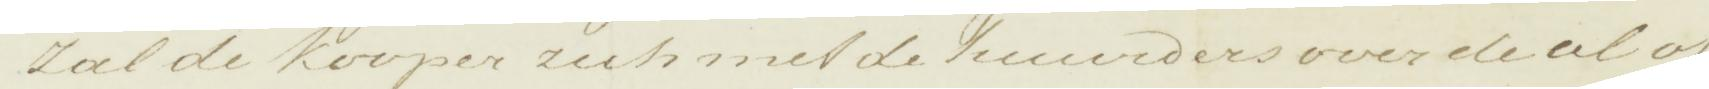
zal de kooper zich met de huurders over de al o
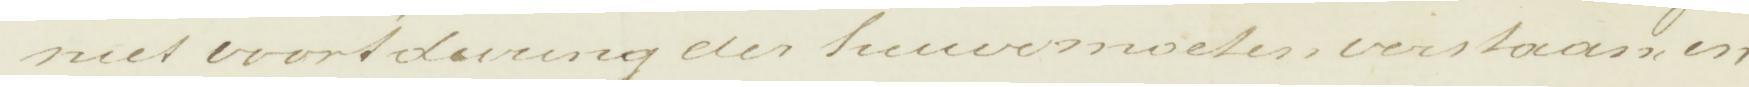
niet voortduring der huur moeten verstaan in
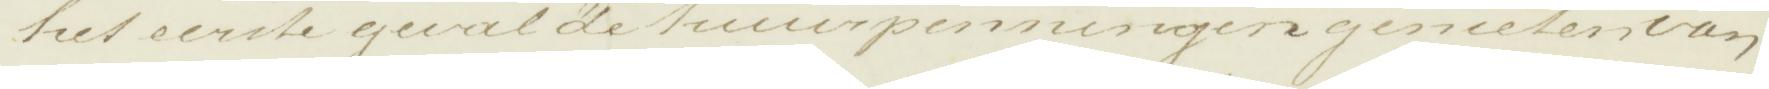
het eerste geval de huurpenningen genieten van
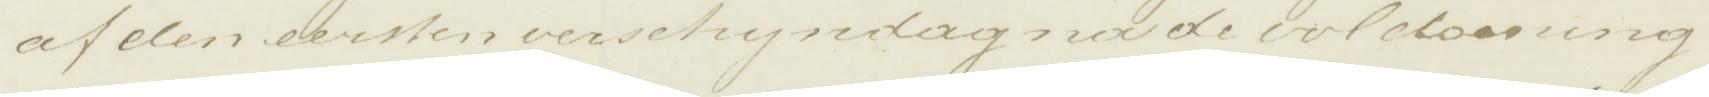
af den eersten verschyndag na de voldoening
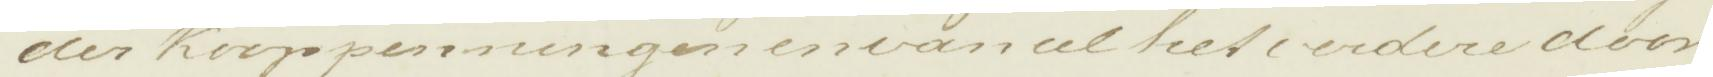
der kooppenningen en van al het verdere door
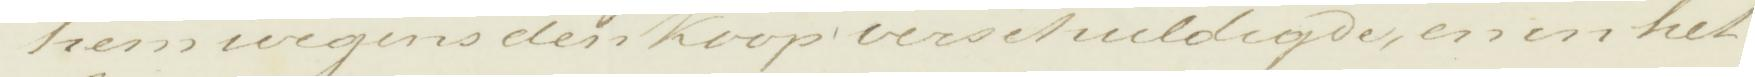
hem wegens den koop verschuldigde, en in het
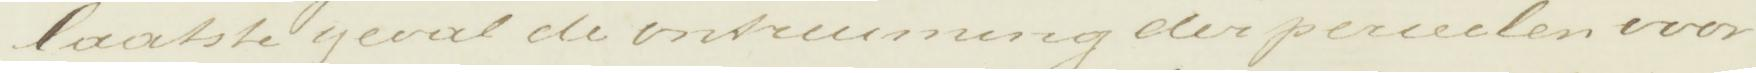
laatste geval de ontruiming der perceelen voor
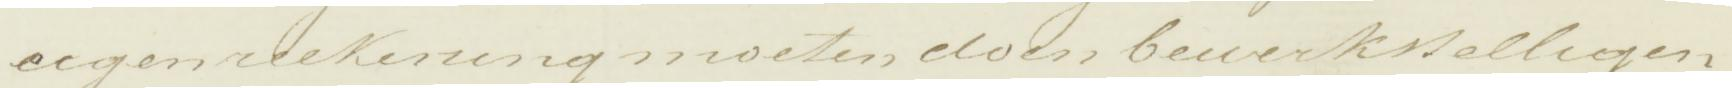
eigen reekening moeten doen bewerkstelligen
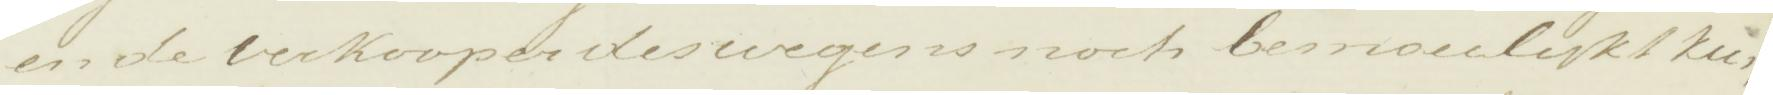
en de verkooper des wegens noch bemoeilykt kun
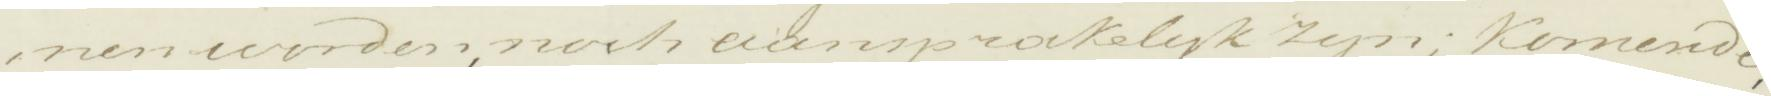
,nen worden, noch aansprakelyk zyn; komende
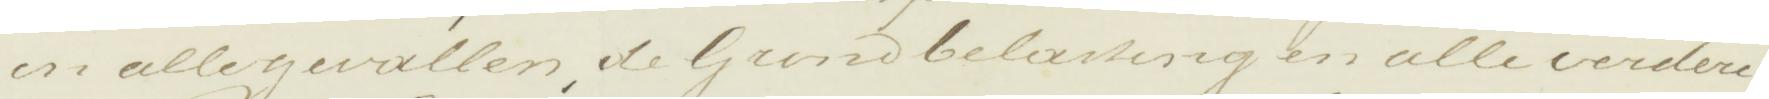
in alle gevallen, de Grond belasting en alle verdere
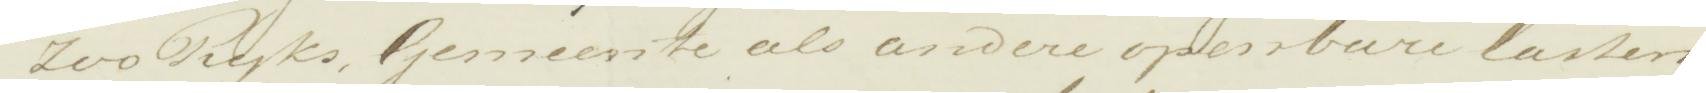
zoo Ryks, Gemeente als andere openbare lasten
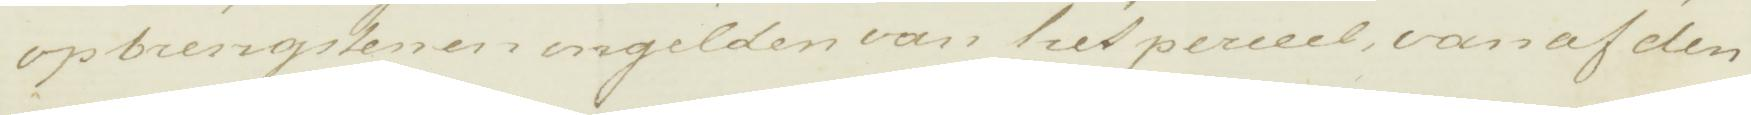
opbrengsten en ongelden van het perceel, van af den
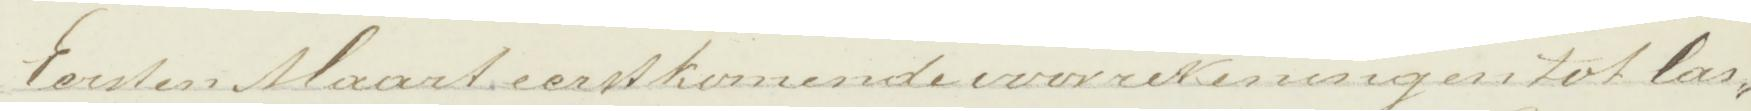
Eersten Maart eerstkomende voor rekening en tot las
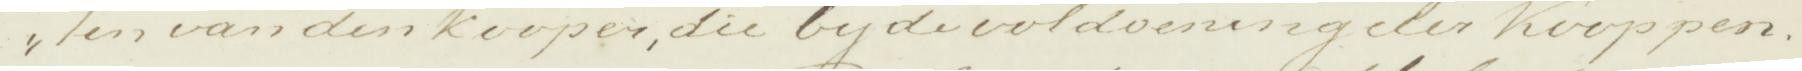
„ten van den kooper, die bij de voldoening der Kooppen.
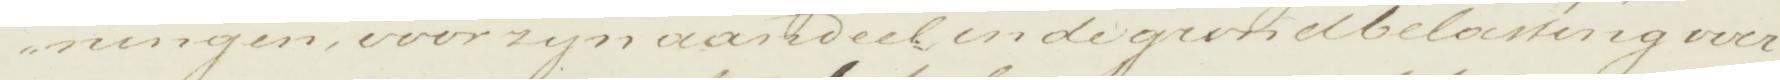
„ningen, voor zyn aandeel in de grondbelasting over
